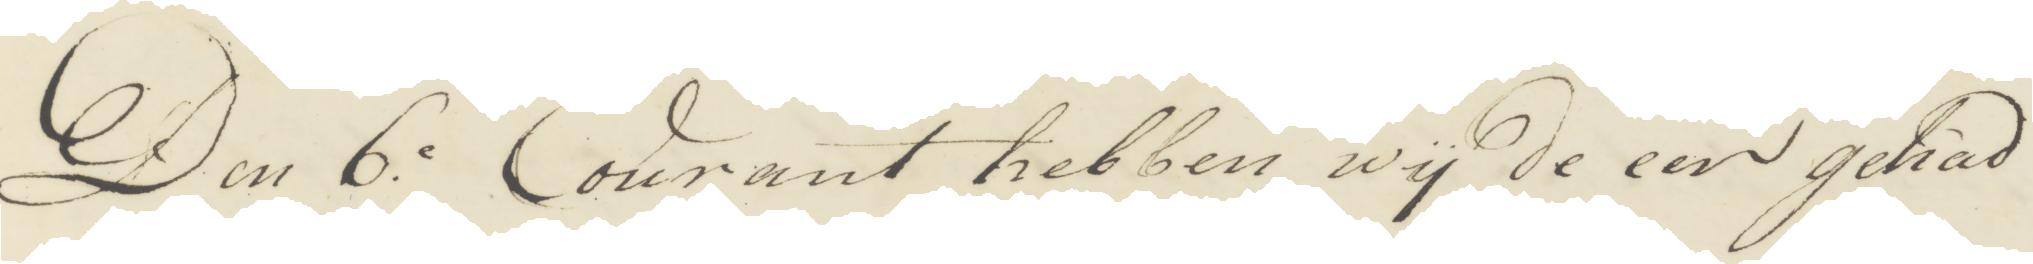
Den 6.e Courant hebben wij de eer gehad
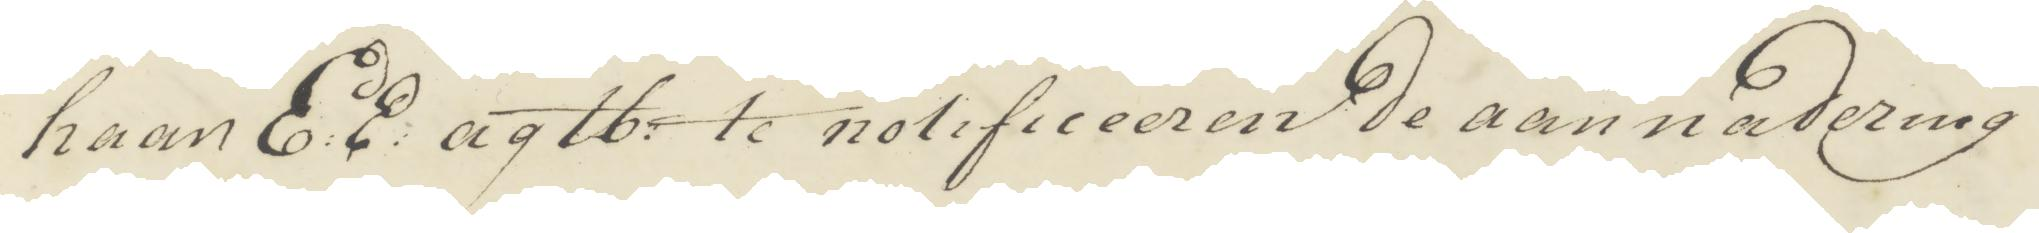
haar E: E: agtb: te notificeeren de aannadering
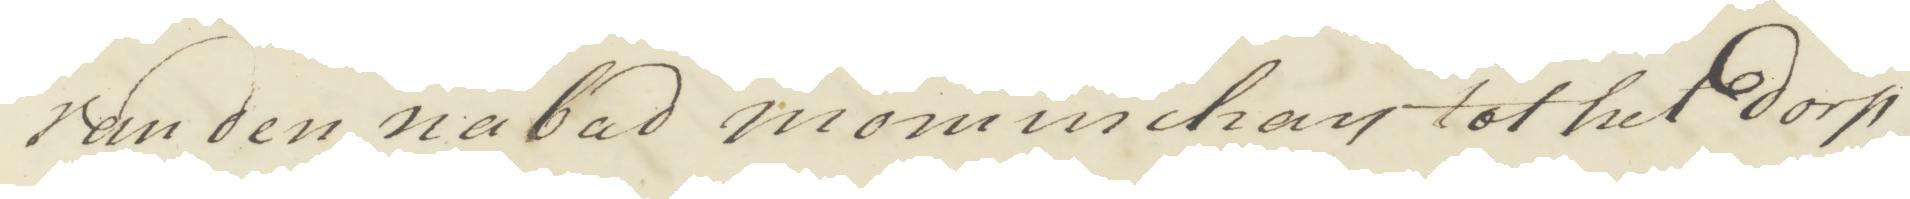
van den nabad mommchan tot het dorp
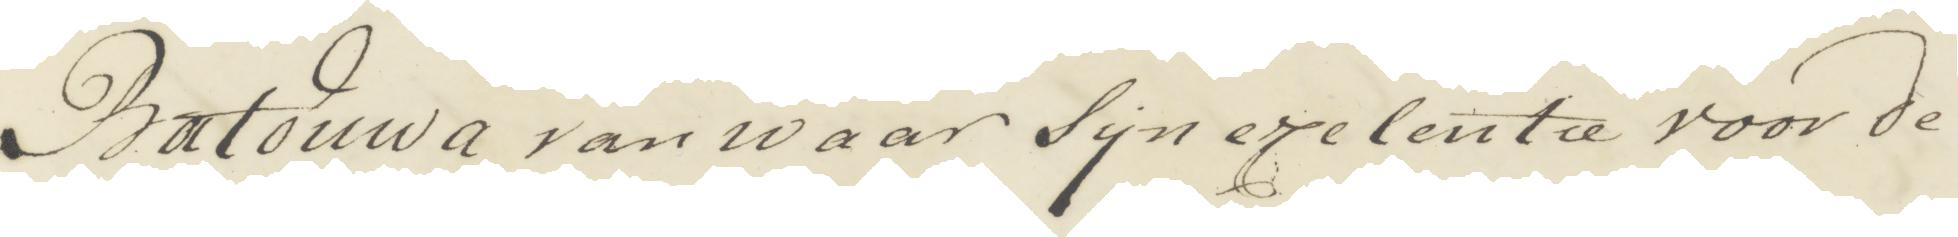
Batouwa van waar sijn exelentie voor de
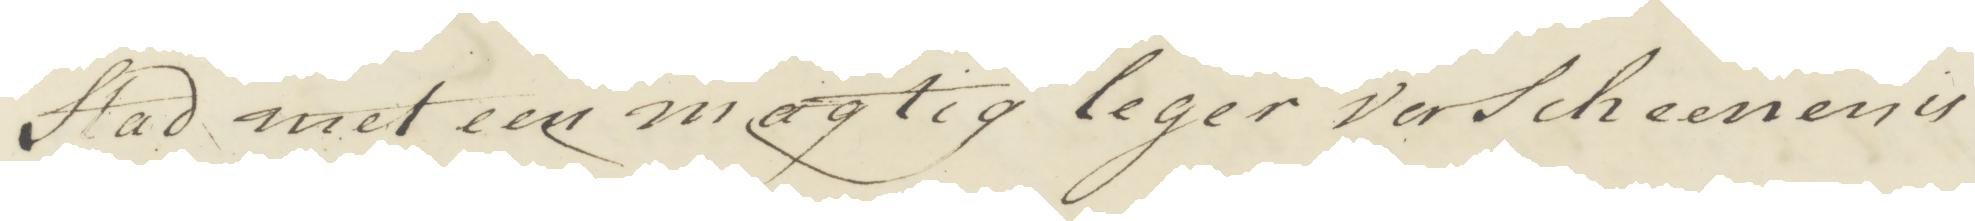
stad met een magtig leger verscheenen is
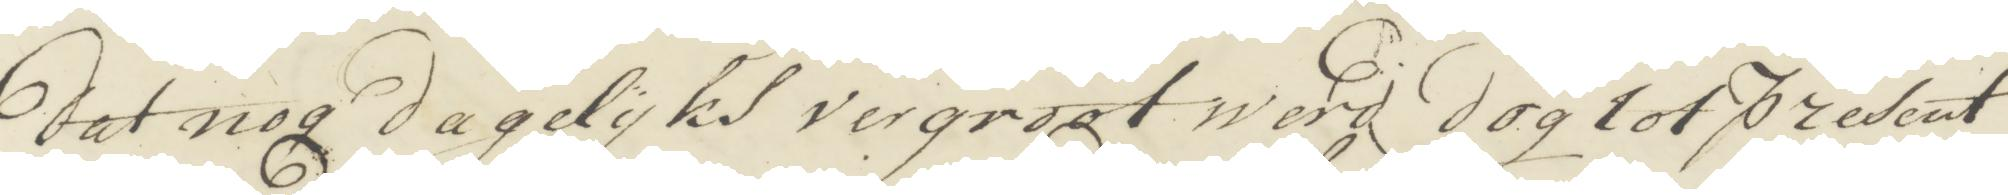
dat nog dagelijks vergroot werd dog tot Present
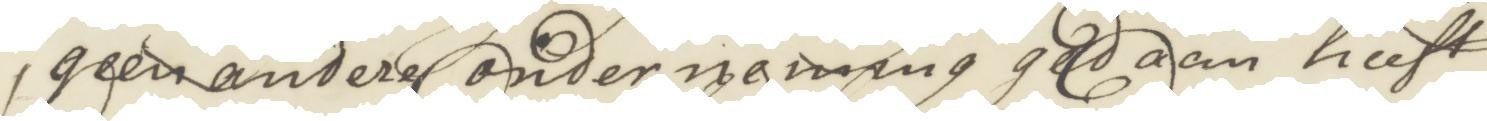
geen andere onder neming gedaan heeft
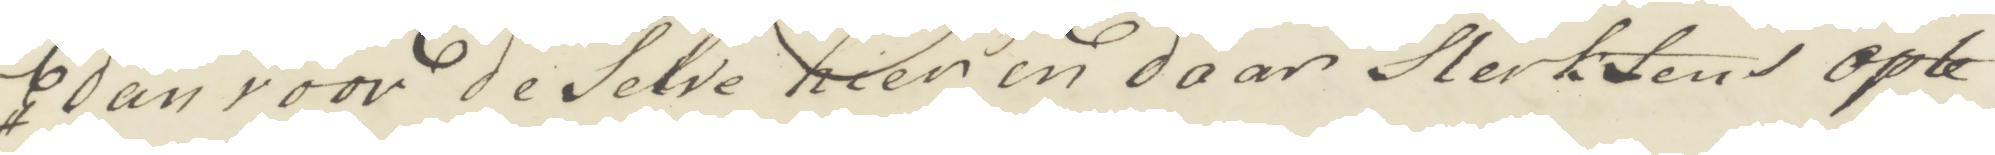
„ dan voor de selve hier en daar sterktens opte
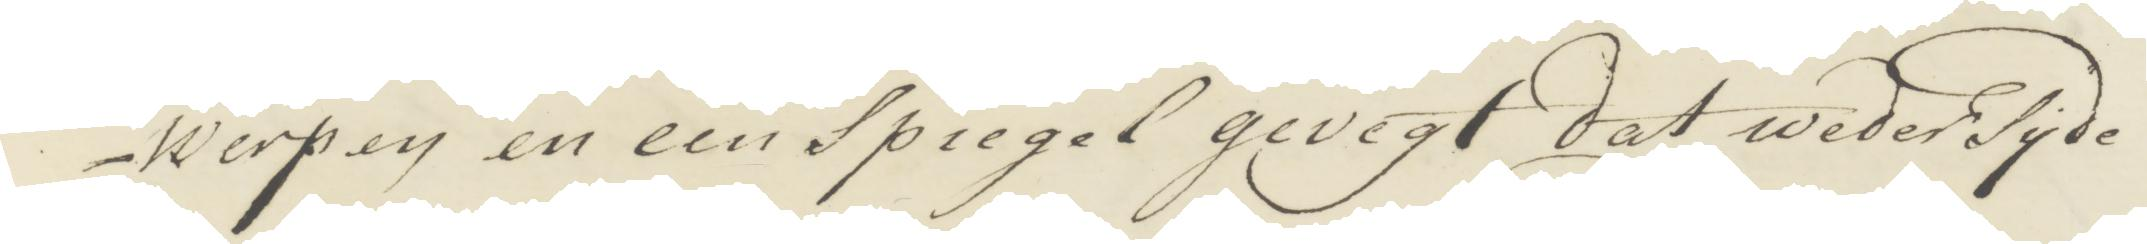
-werpen en een spiegel gevegt dat weder sijde
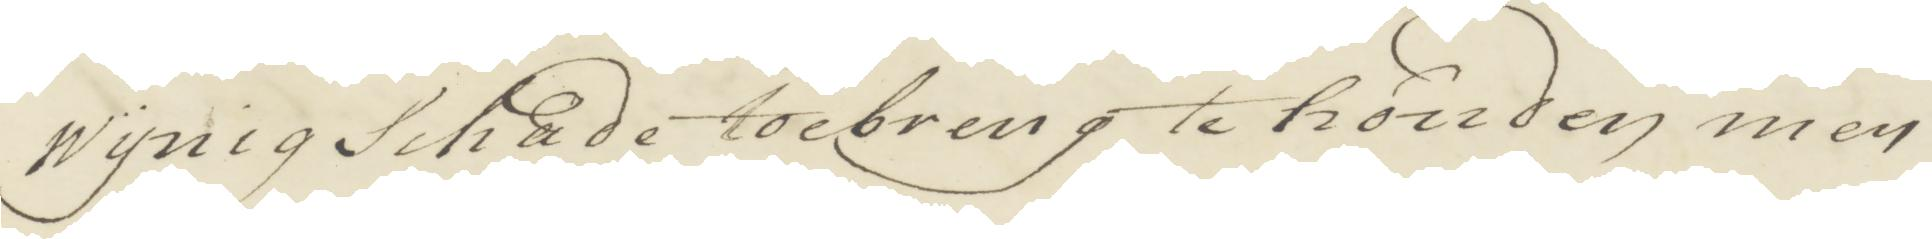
wijnig schade toebreng te houden men
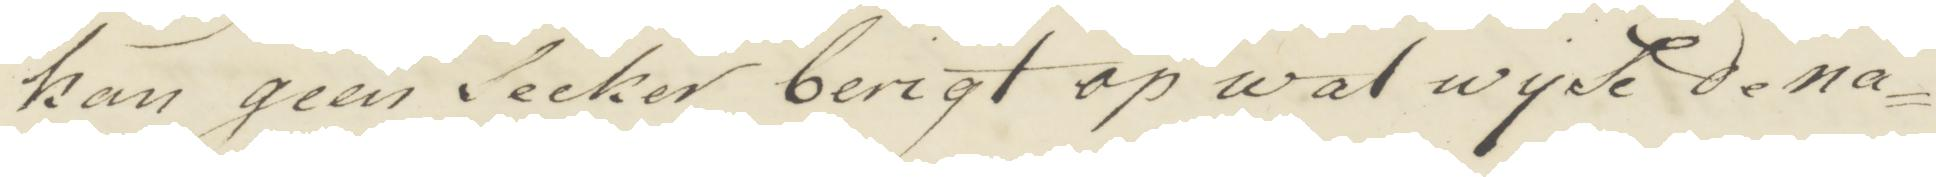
kan geen seeker berigt op wat wijse de na=
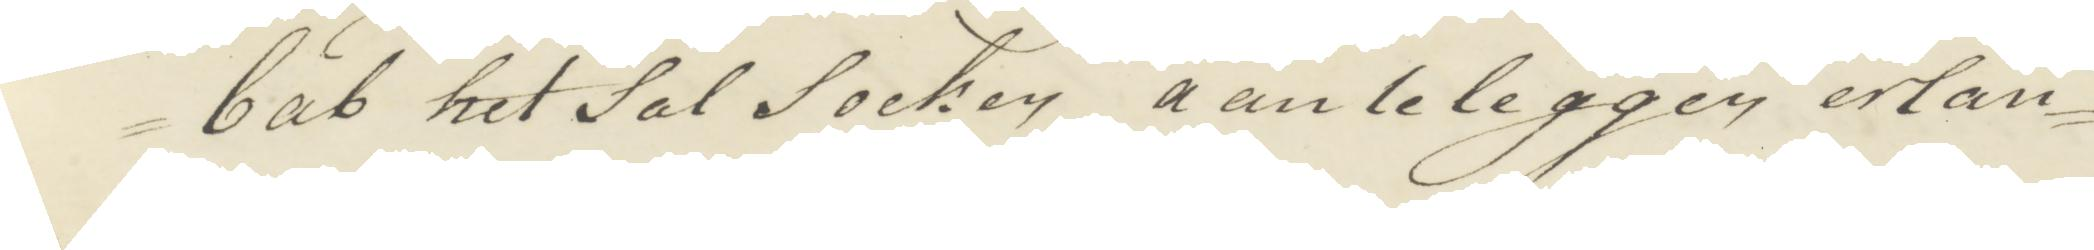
=bab het sal soeken aan te leggen erlan=
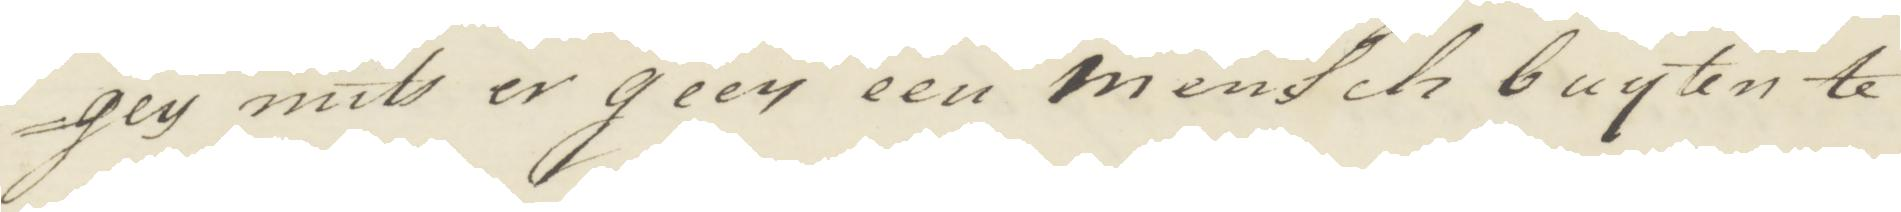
=gen mits er geen een mensch buyten te
